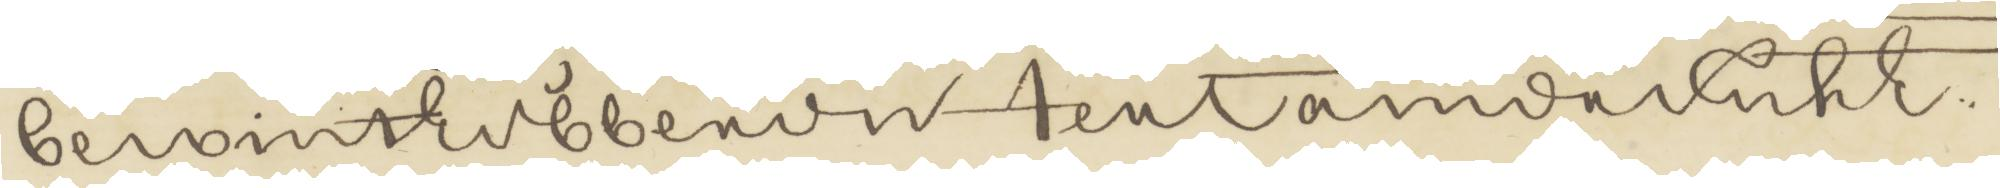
bewinthebberen ter Camer Enkh:
